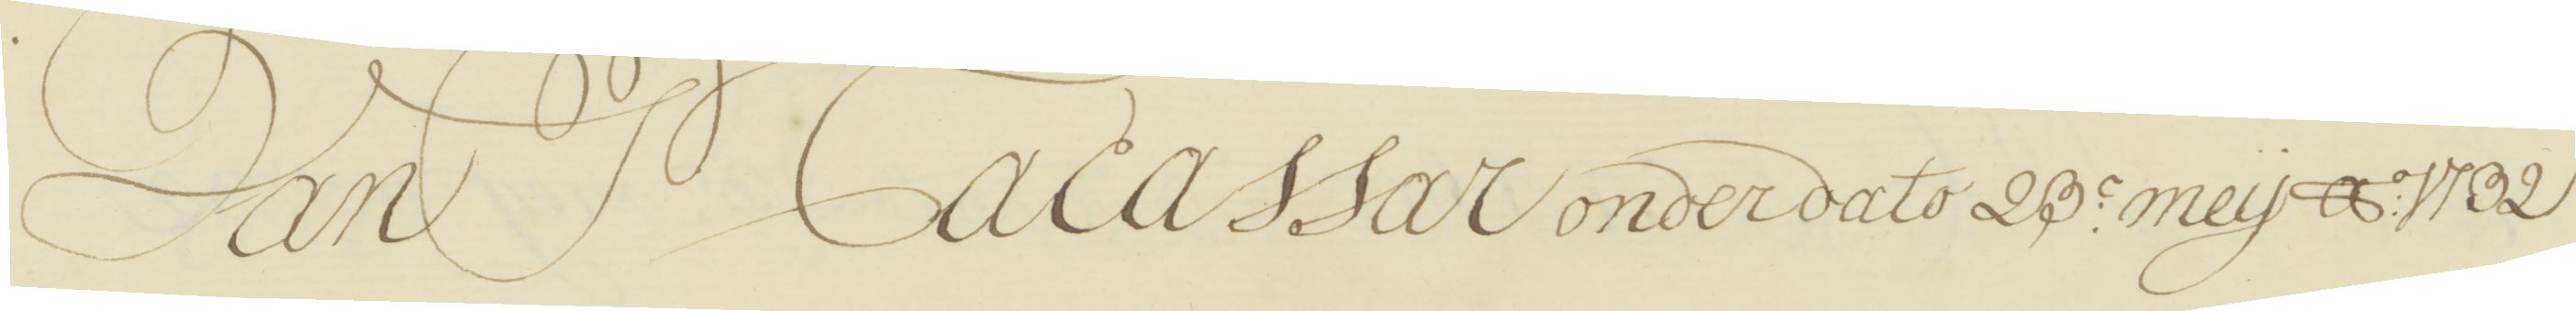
Van Macassar onder dato 23:' meij A:o 1732
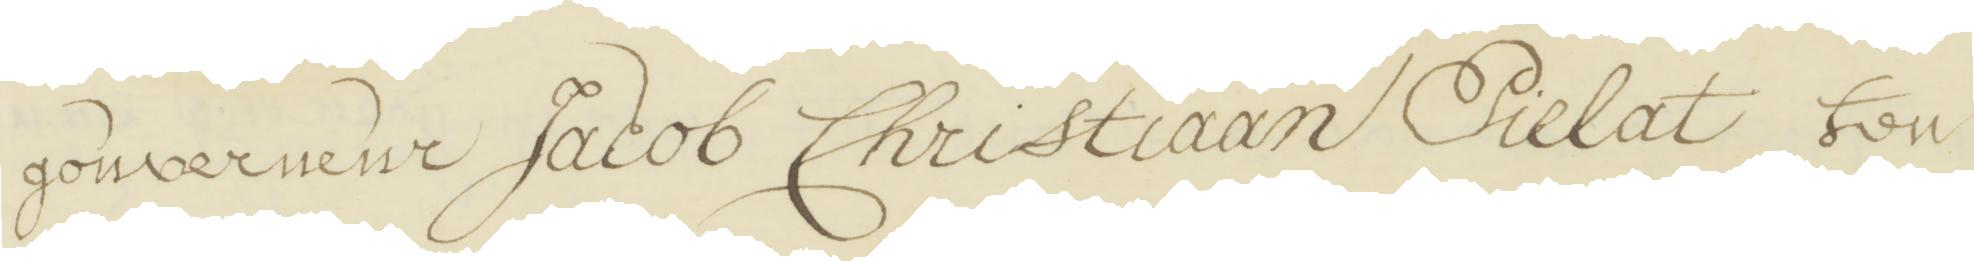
gouverneur Jacob Christiaan Pielat ten
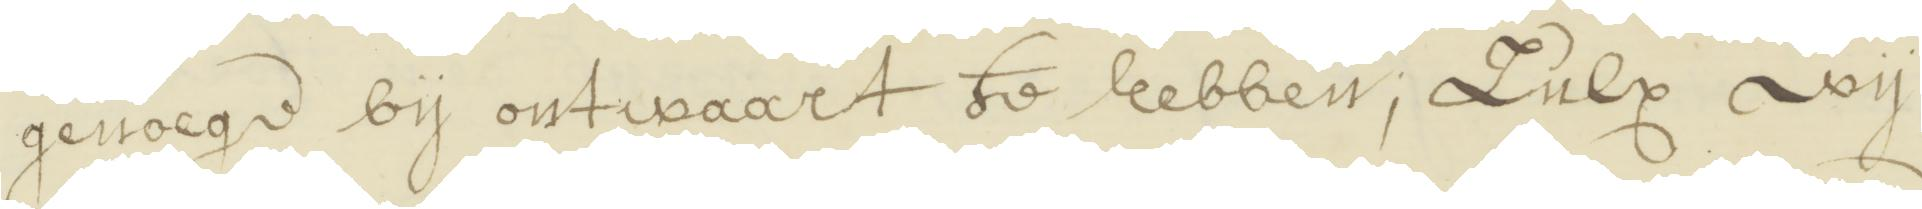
genoege bij ontwaart te hebben; zulx wij
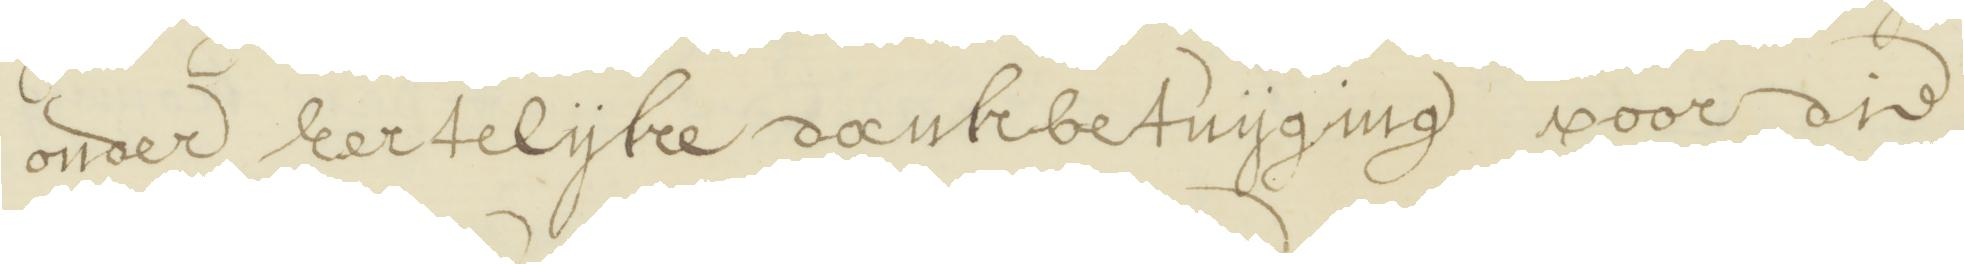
onder hertelijke dankbetuijging voor die
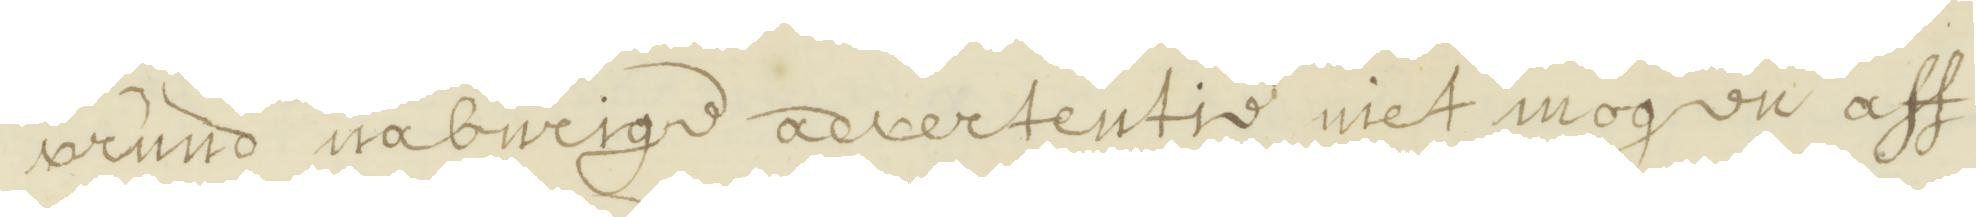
vrund naburige advertentie niet mogen aff
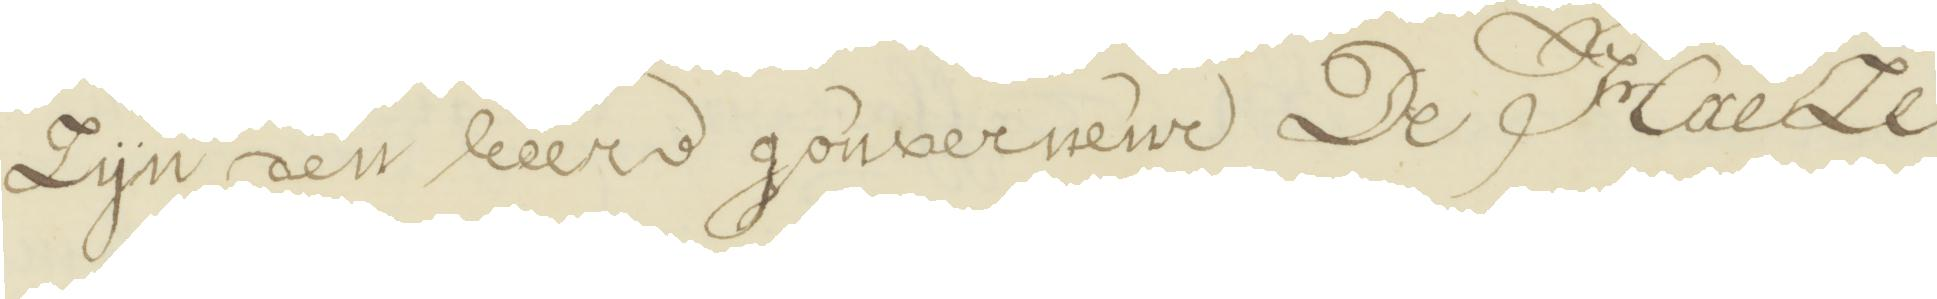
zijn den heere gouverneur De Haeze
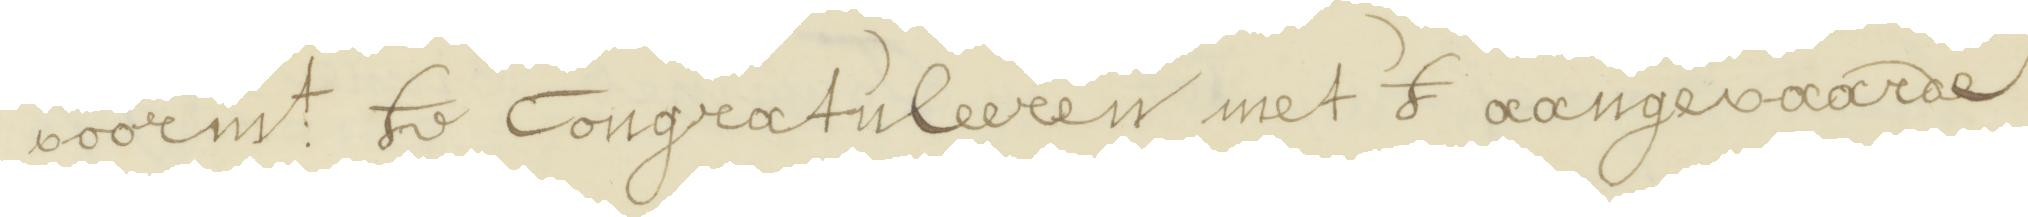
voorm:t te congratuleeren met ’t aangevaarde
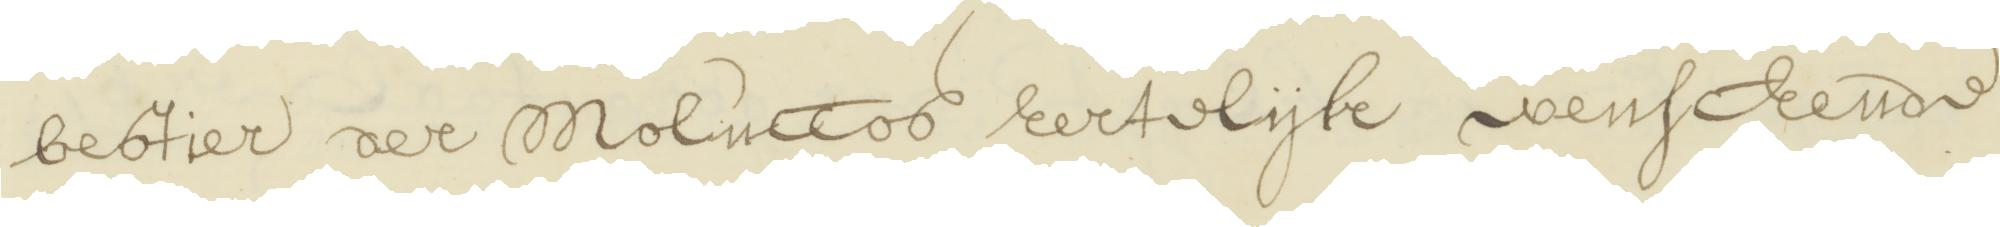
bestier der Moluccos hertelijk wenschende
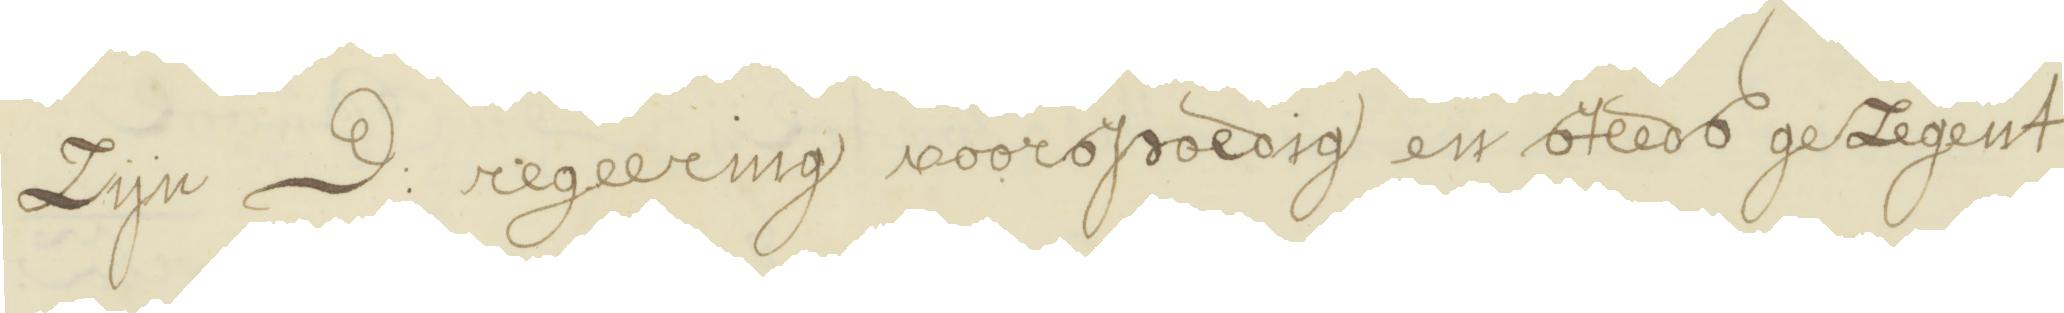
zijn E: regeering voorspoedig en steeds gezegent
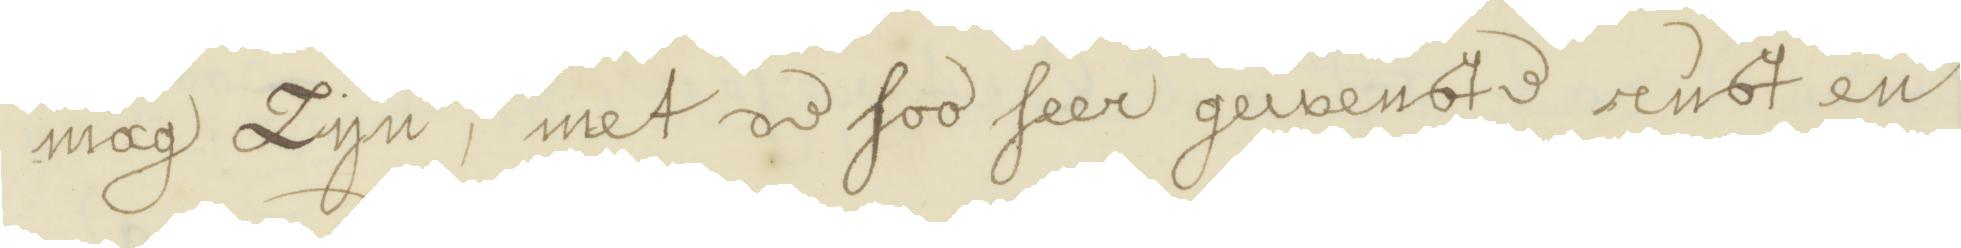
mag zijn, met de soo seer gewenste rust en
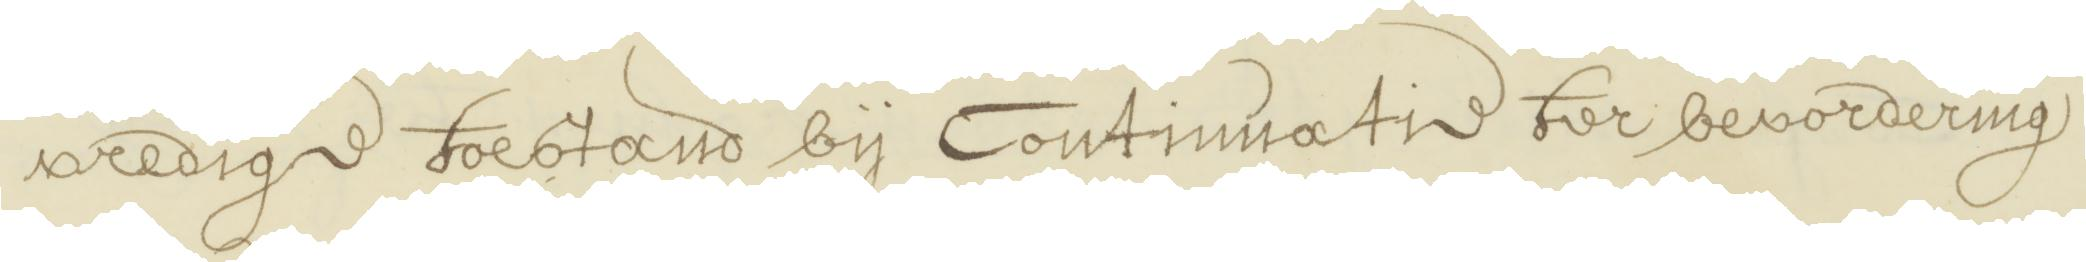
vredige toestand bij continuatie ter bevordering
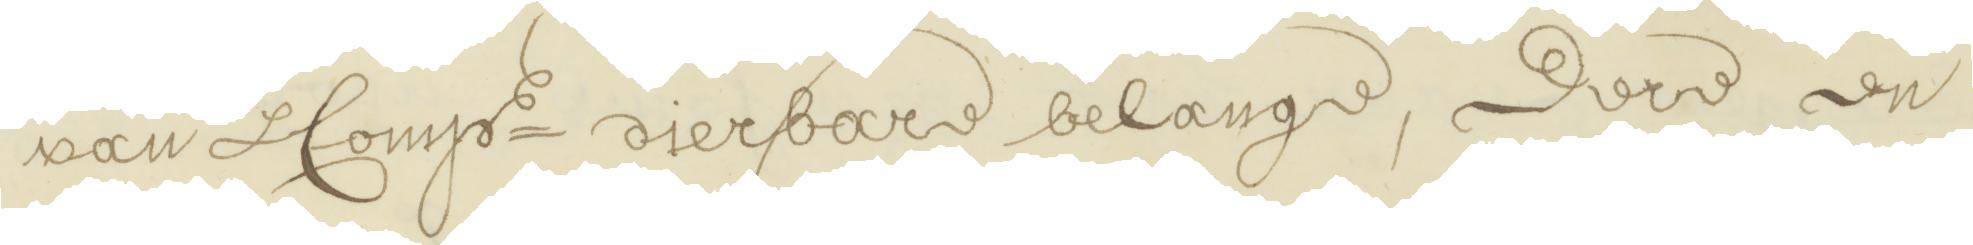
van 's Comp=s dierbare belange, Eere en
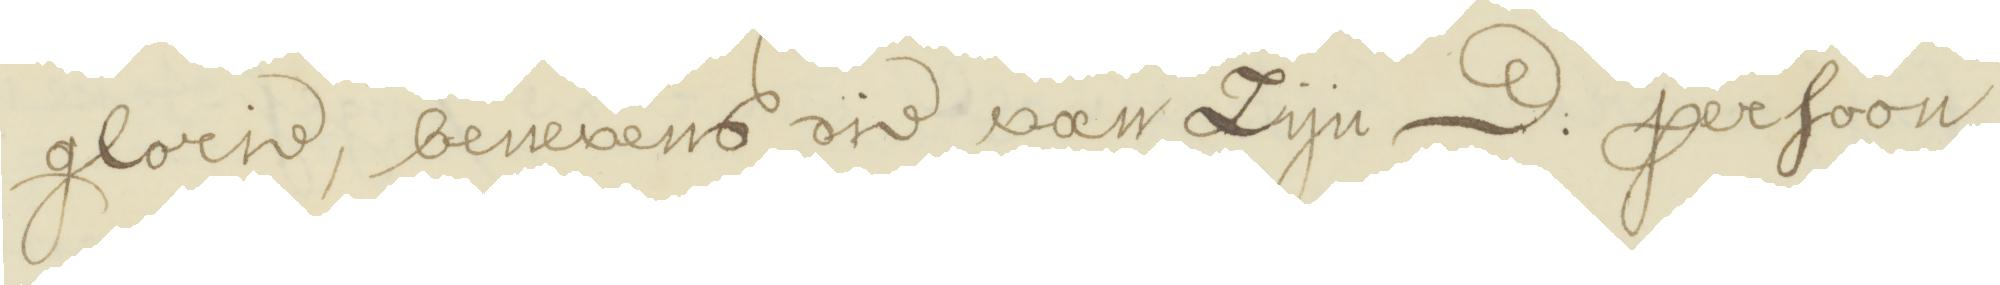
glorie, benevens die van zijn E: persoon
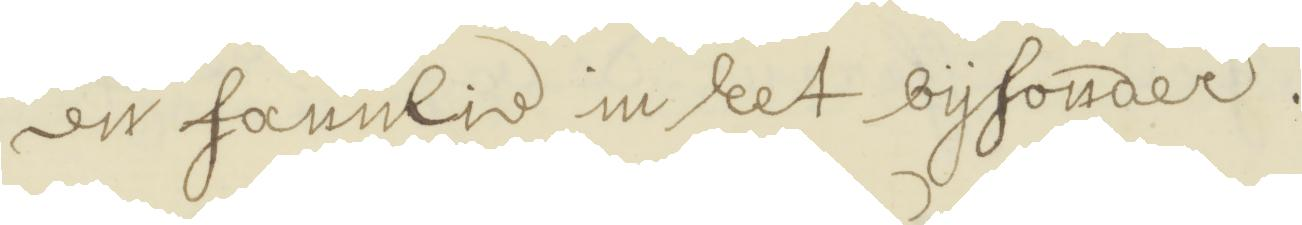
en familie in het bijsonder.
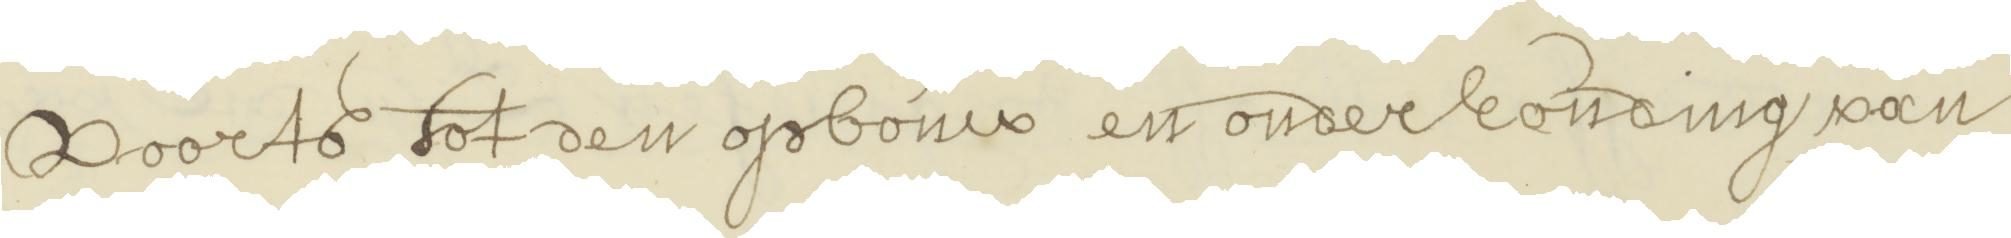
voorts tot den opbouw en onderhouding van
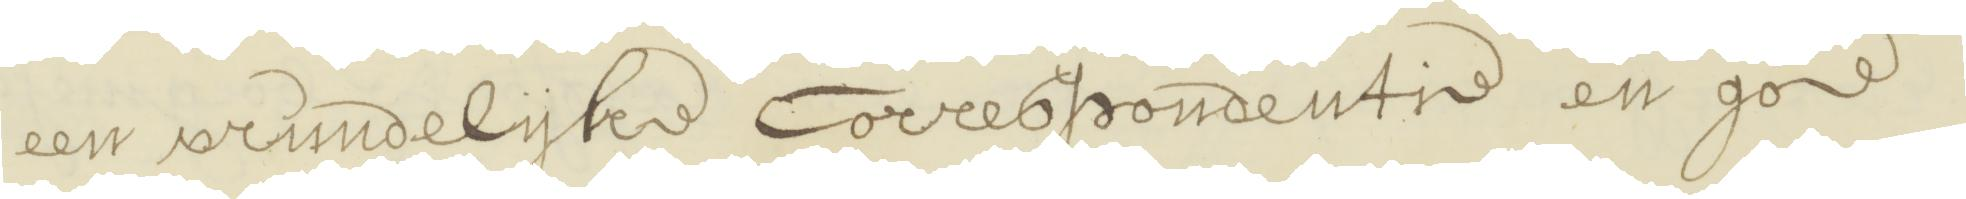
een vrundelijke correspondentie en goe
